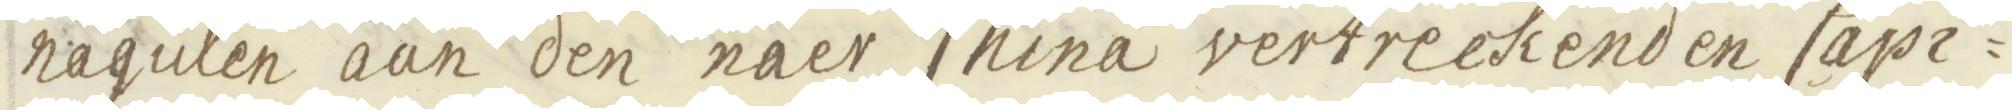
nagulen aan den naer China vertreckenden Capi=
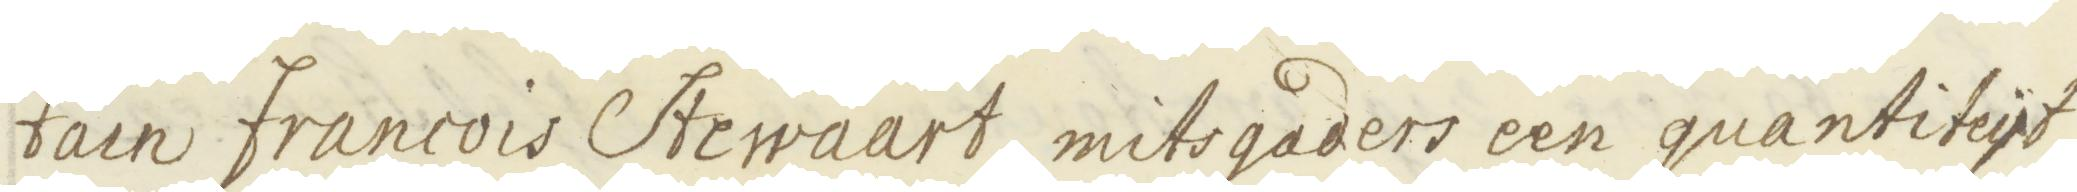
tain Francois Stewaart, mitsgaders een quantiteijt
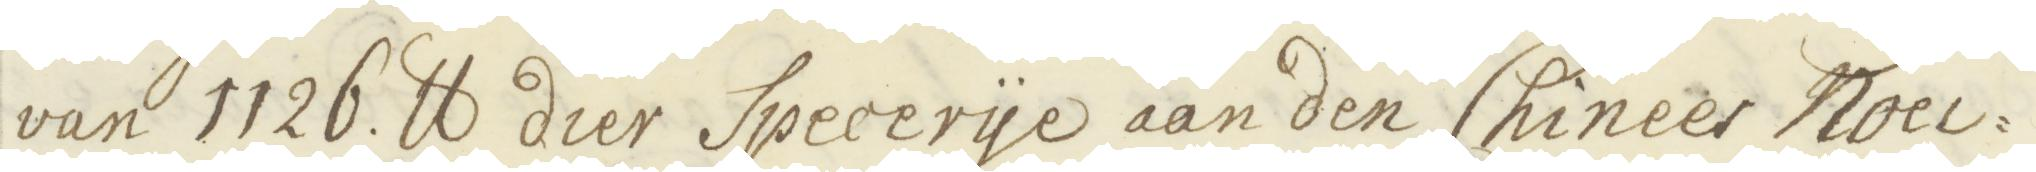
van 1126. lb dier specerije aan den Chinees Noec=
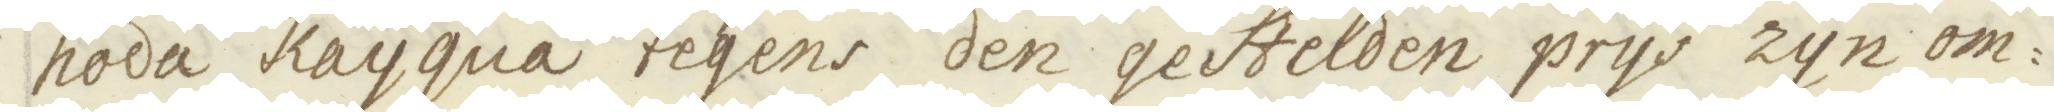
hoda kaijqua tegens den gestelden prijs zijn om=
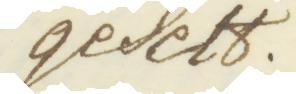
geselt.
